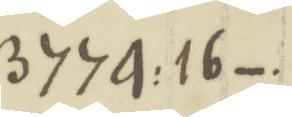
3774:16 – .
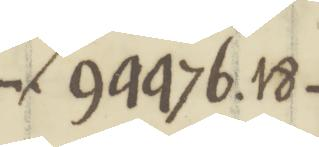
ƒ94476.18
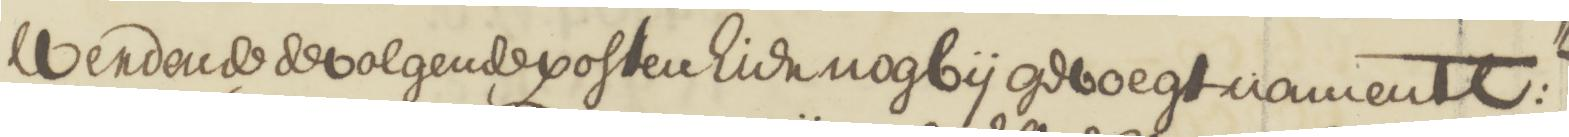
werdende de volgende posten hier nog bij gevoegt namentlijk
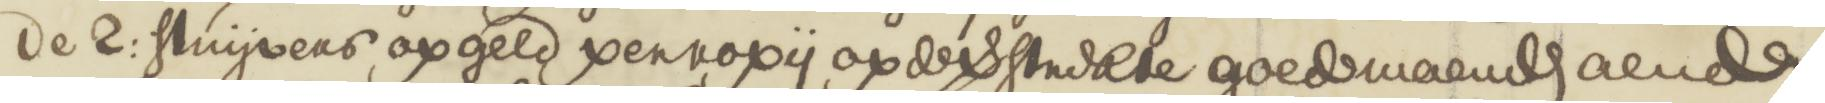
de 2: stuijvers opgeld per ropij op de verstrekte goede maenden aende
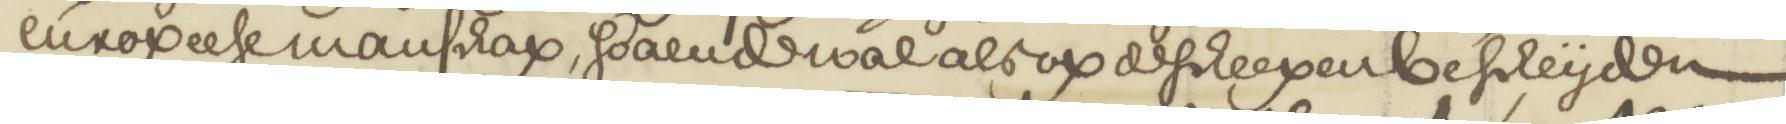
europeese manschap, so aende wal als op de scheepen bescheijden
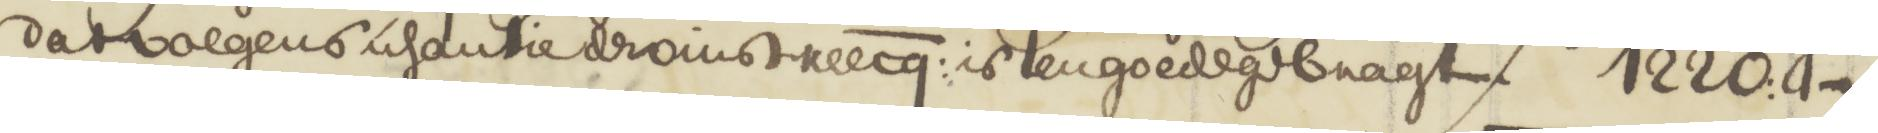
dat volgens usantie dewinst reecq: is ten goede gebragt ƒ 1220:4 –
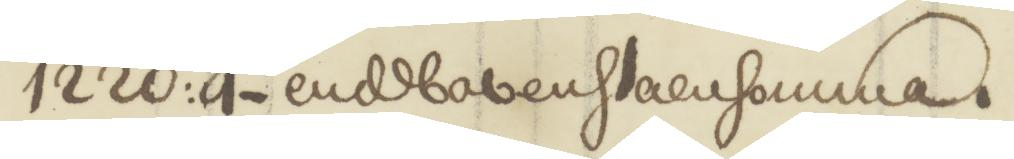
1220:4 – en de bovenstaen somma.
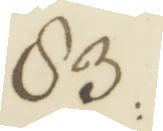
83:
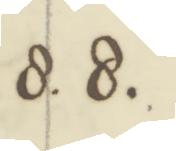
8. 8.
